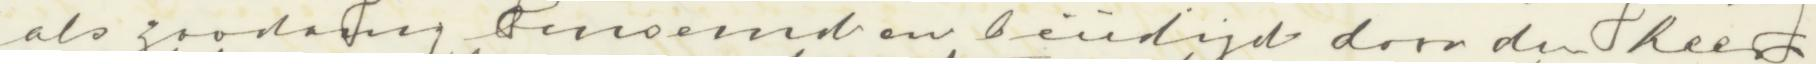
als zoodanig benoemd en beëedigd door den heer
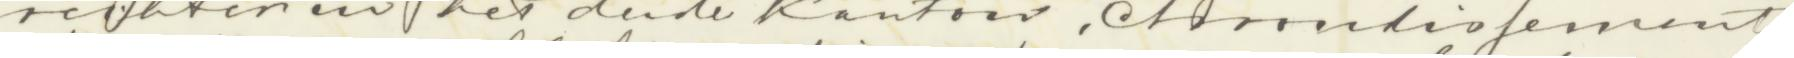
rechter in het derde Kantoor, Arrondissement-
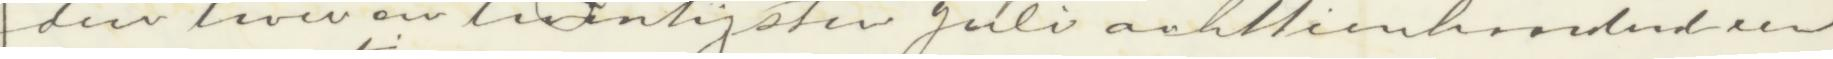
den twee en twintigsten Juli achttienhonderd een
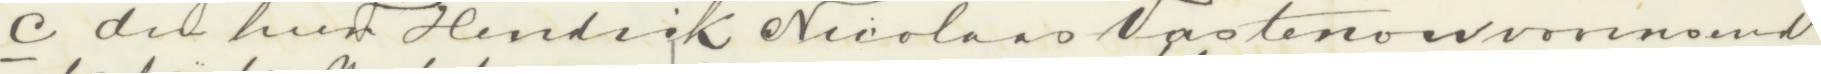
C den heer Hendrik Nicolaas Vastenou voornoemd,
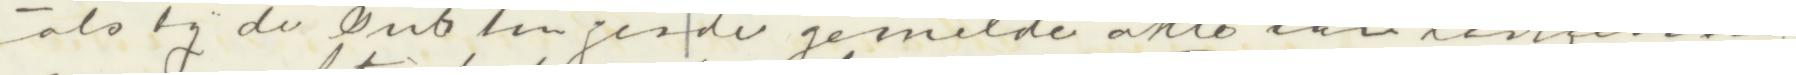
als bij de sub ten zesde gemeld akte van lastgeving
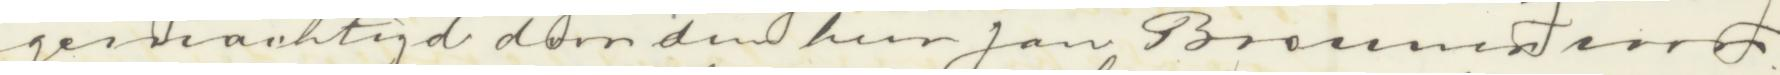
gemachtigd door den heer Jan Brouwer voor
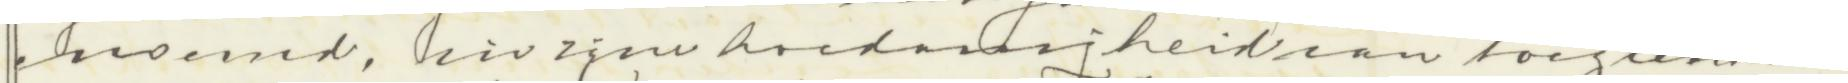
noemd, in zijne hoedanigheid van toezienden
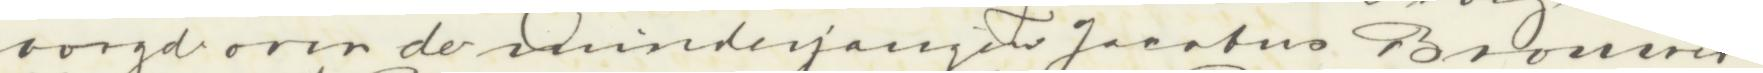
voogd over de minderjarigen Jacobus Brouwer
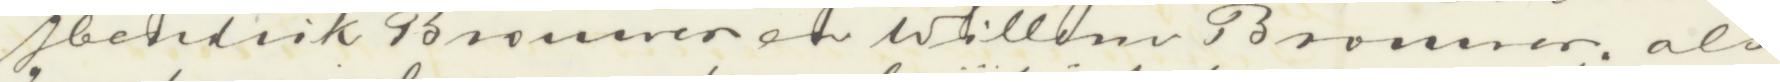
Hendrik Brouwer en Willem Brouwer, als
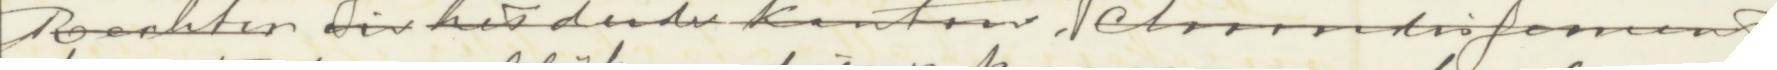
Rechter in het derde Kantoor, Arrondissement
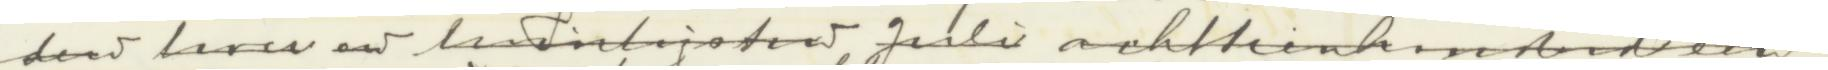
den twee en twintigsten Juli, achttienhonderd een
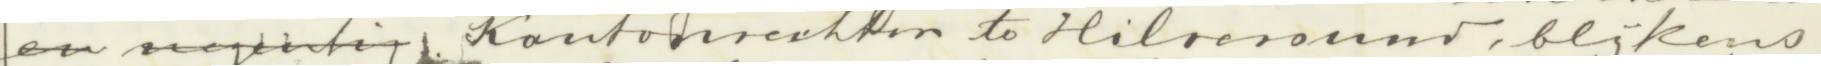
en negentig Kantonrechter te Hilversum, blijkens
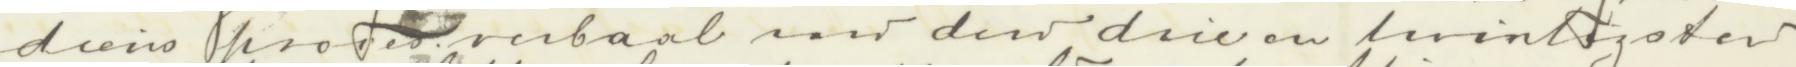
diens proces verbaal van den drie en twintigsten
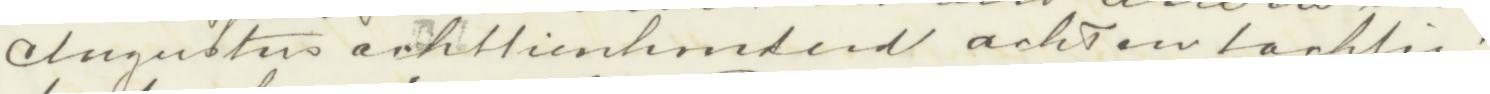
Augustus achttienhonderd acht en tachtig;
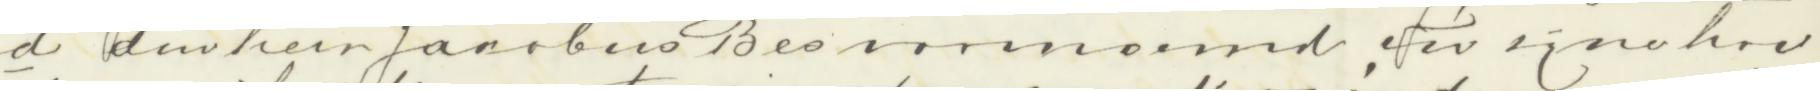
d den heer Jacobus Bes voornoemd, in zijnen hoe
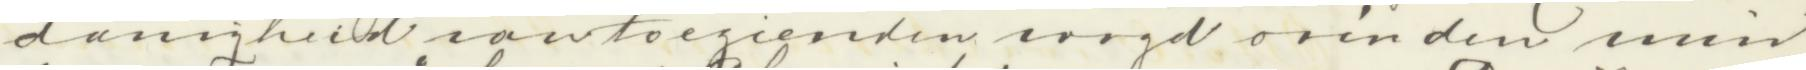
danigheid van toezienden voogd over den min
